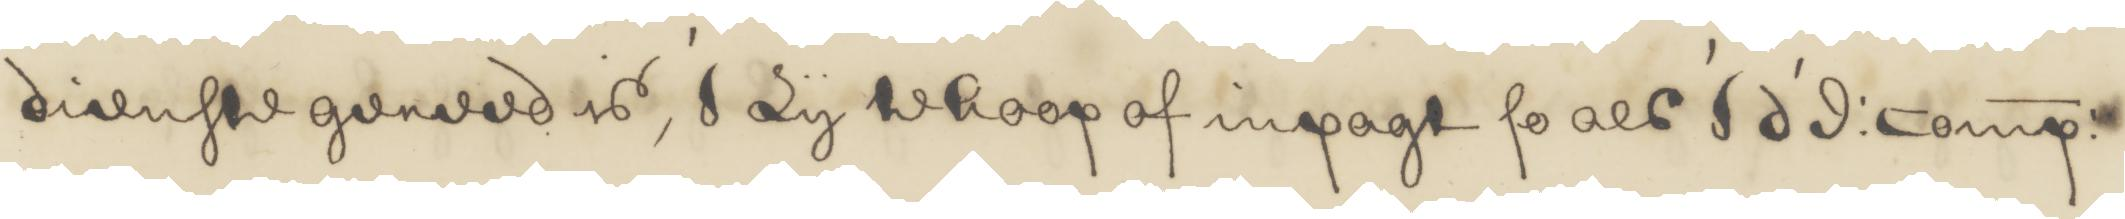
dienste gereed is, ’t zij te koop of inpagt so als 't d’E: Comp:
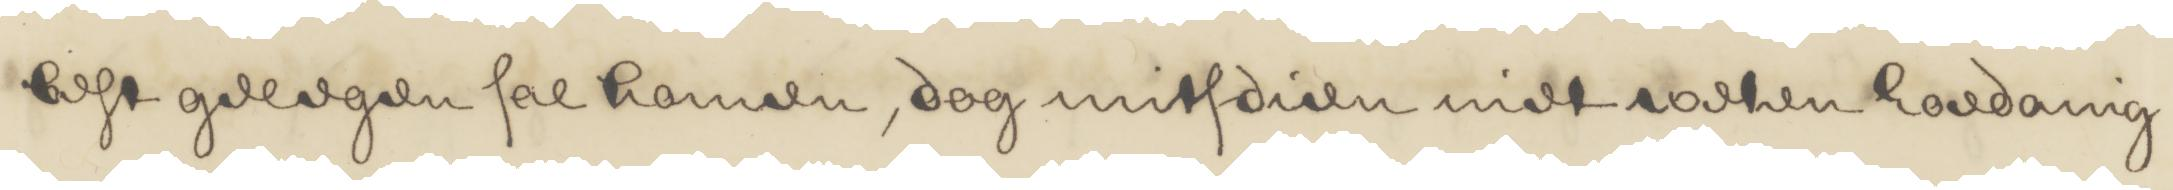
best gelegen sal komen, dog mitsdien niet weten hoedanig
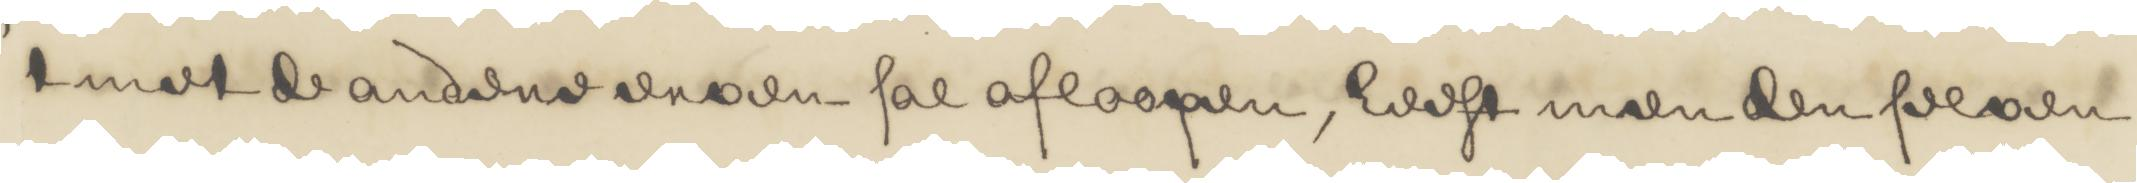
’t met de andere erven sal afloopen, heeft men den selven
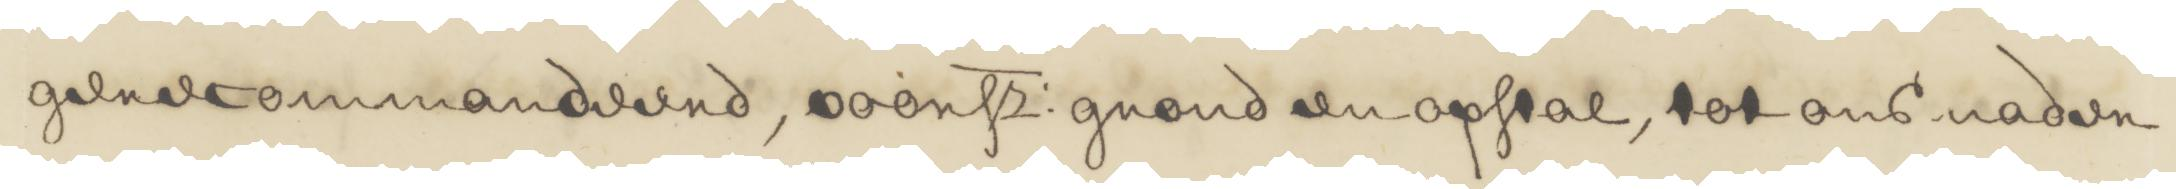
gerecommandeerd, voorsz: grond en opstal, tot ons nader
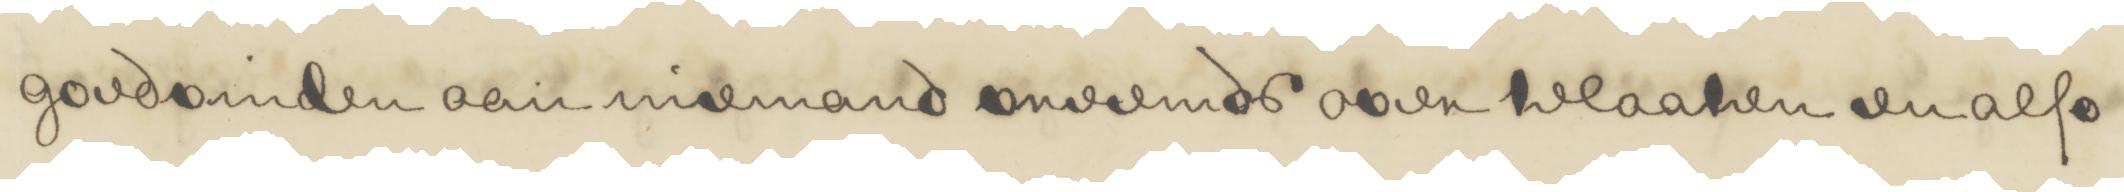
goedvinden aan niemand vreemds over telaaten en also
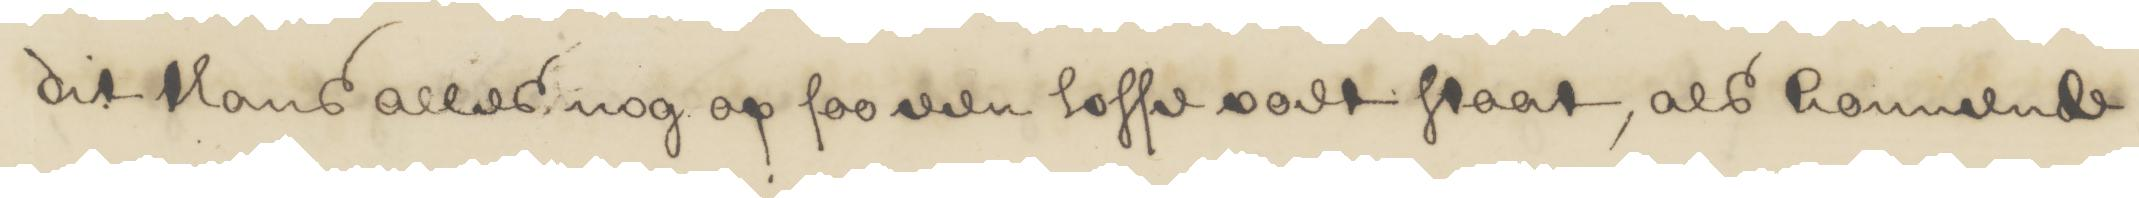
dit thans alles nog op soo een losse voet staat, als konnende
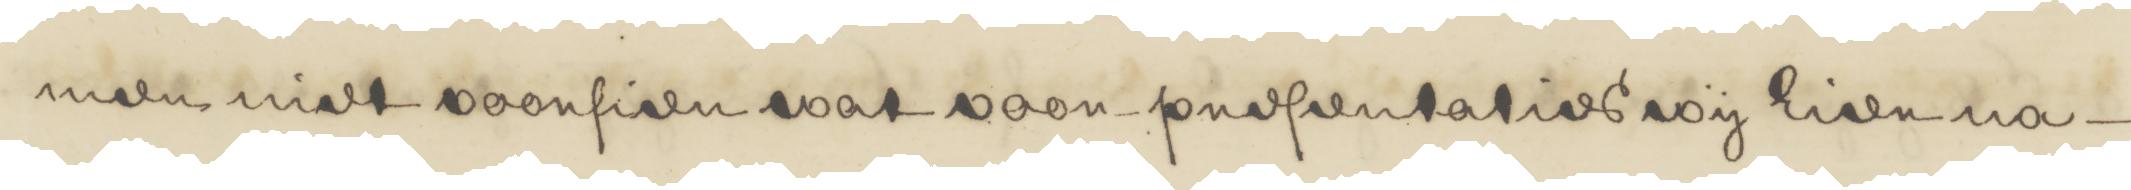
men niet voorsien wat voor presentaties wij hier na —
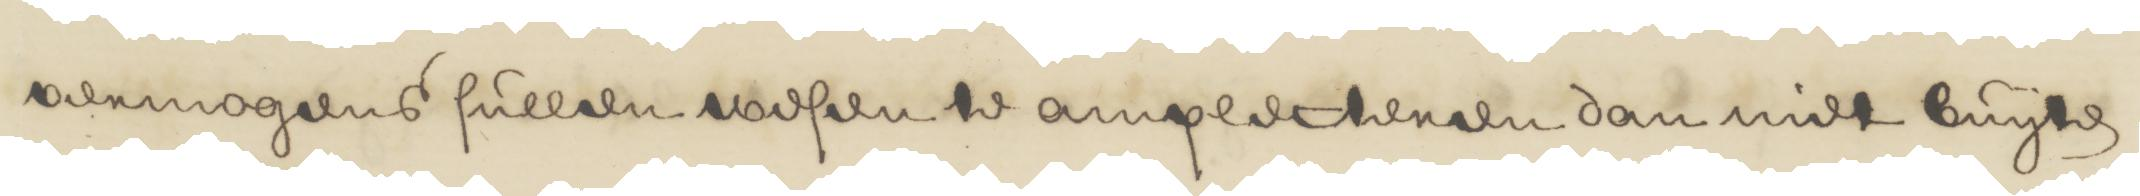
vermogens sullen wesen te amplecteren dan niet buijten
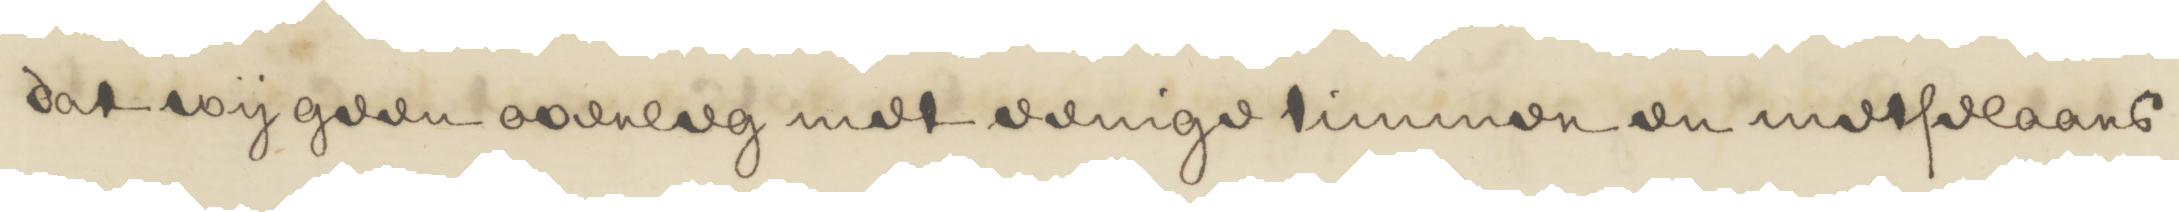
dat wij geen overleg met eenige timmer en metselaars
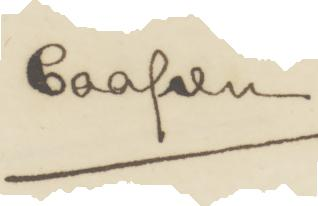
baasen
